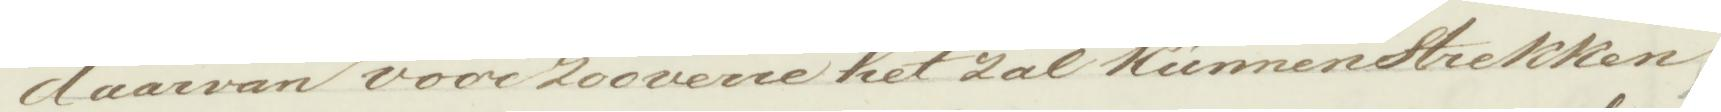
daarvan voor zooverre het zal kunnen strekken
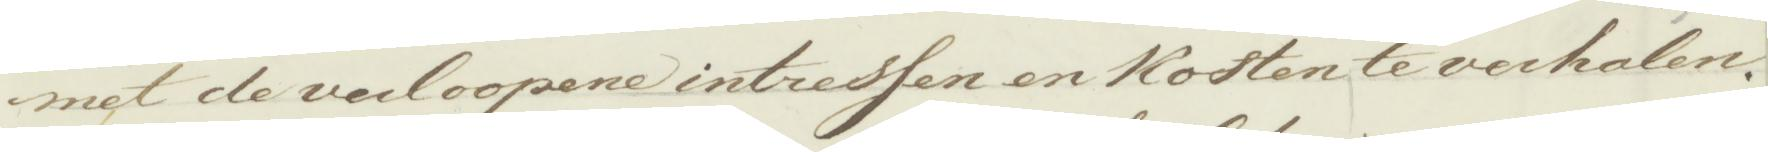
met de verloopene intressen en kosten te verhalen,
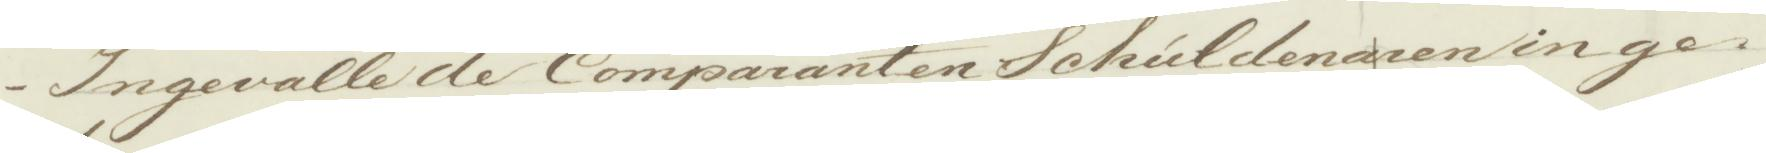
-Ingevalle de Comparanten schuldenaren in ge„
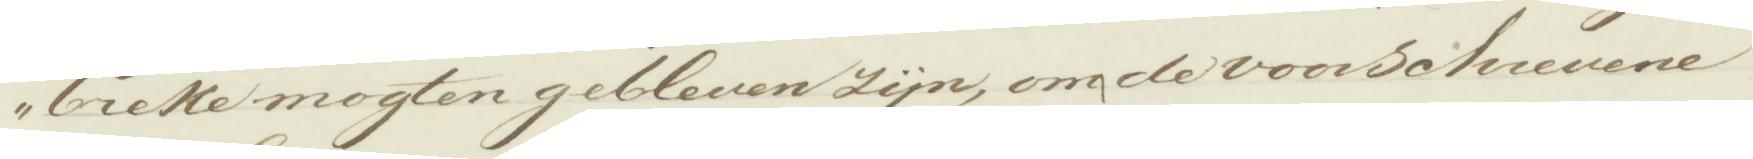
„breke mogten gebleven zijn, om de voorschrevene
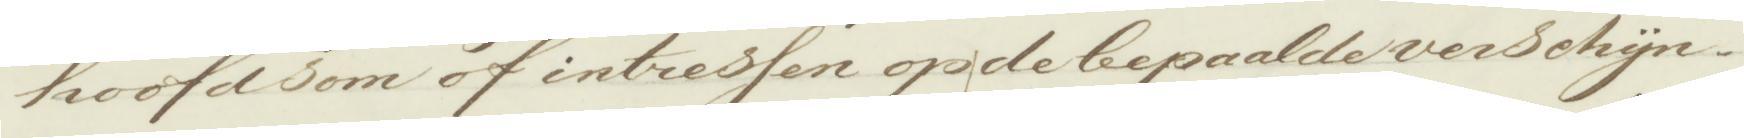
hoofdsom of intressen op de bepaalde verschijn.
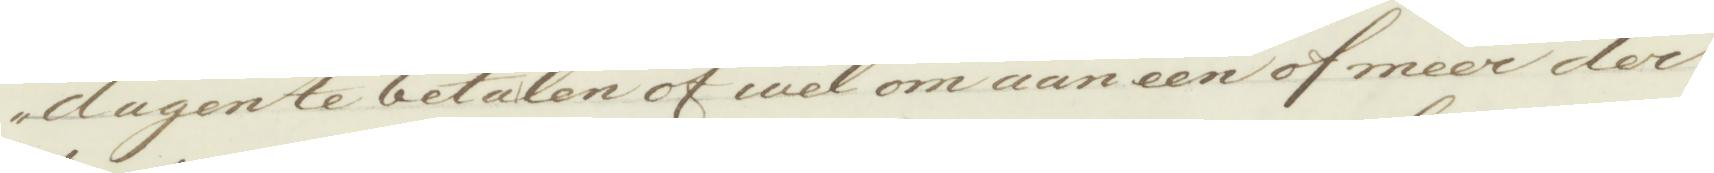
„dagen te betalen of wel om aan een of meer der
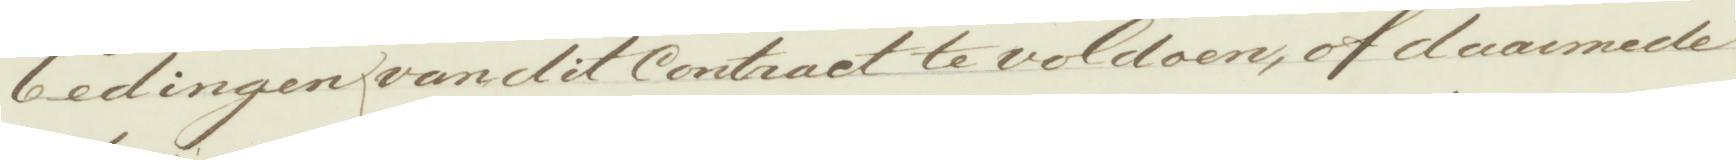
bedingen van dit Contract te voldoen, of daarmede
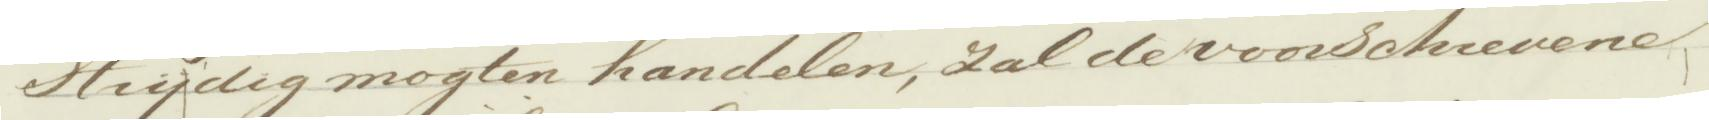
steijdig mogten handelen, zal de voorschrevene
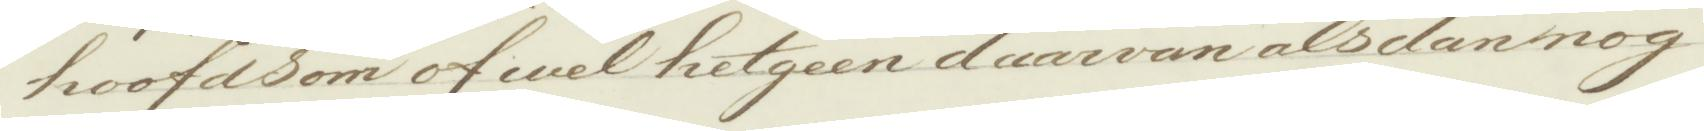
hoofdsom of wel hetgeen daarvan als dan nog
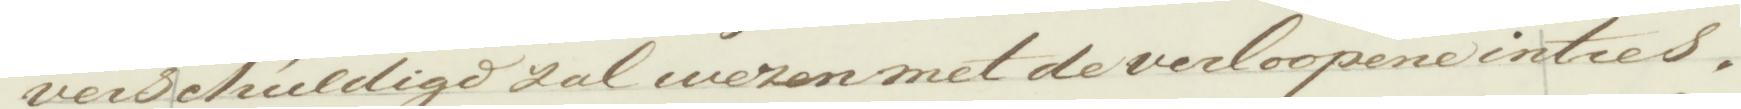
verschuldigd zal wezen met de verloopene intres„
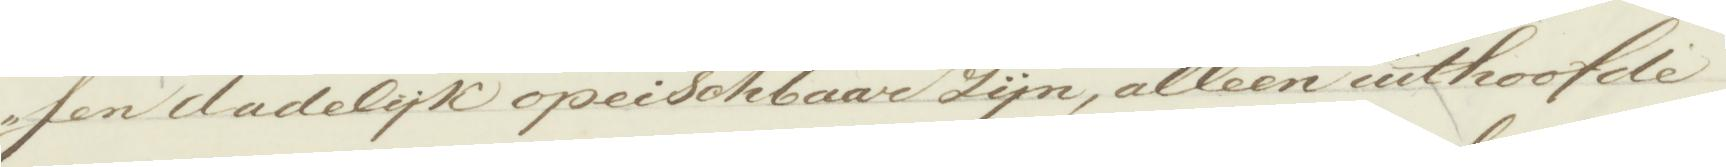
„sen dadelijk opeischbaar zijn, alleen uithoofde
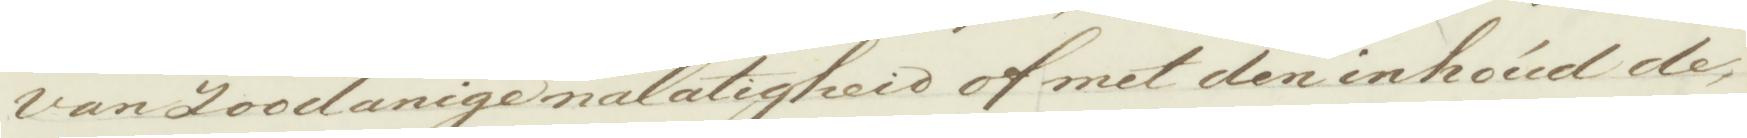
van zoodanige nalatigheid of met den inhoud de„
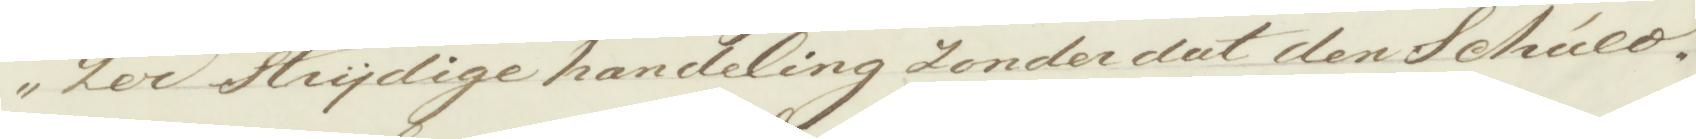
„zer strijdige handeling zonder dat den schuld„
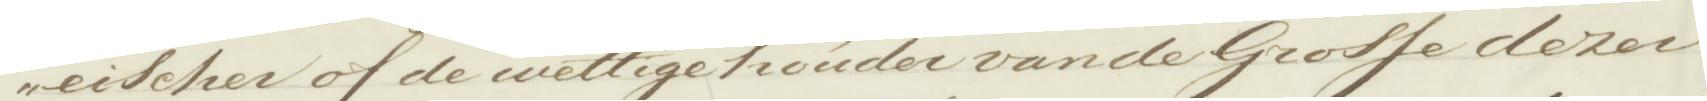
„eischer of de wettige houder van de Grosse dezer
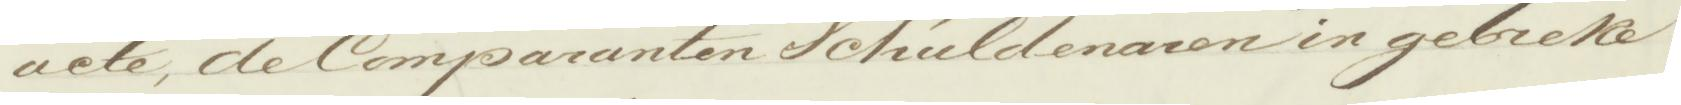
acte, de Comparanten schuldenaren in gebreke
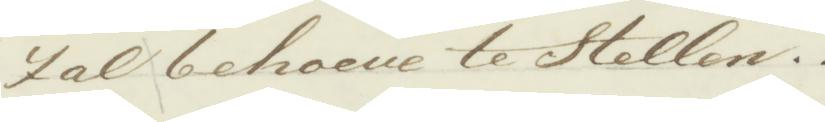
zal behoeve te stellen.
